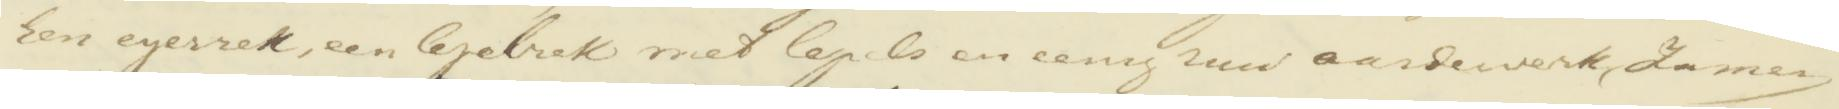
Een eyerrek, een lepelrek met lepels en eenig ruw aardewerk zamen
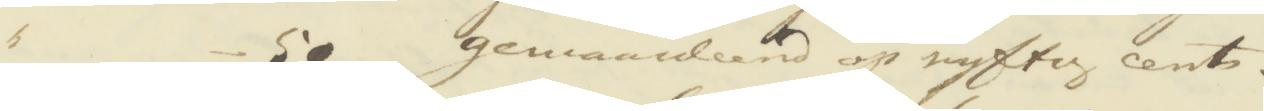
„ – 50 gewaardeerd op vyftig cents
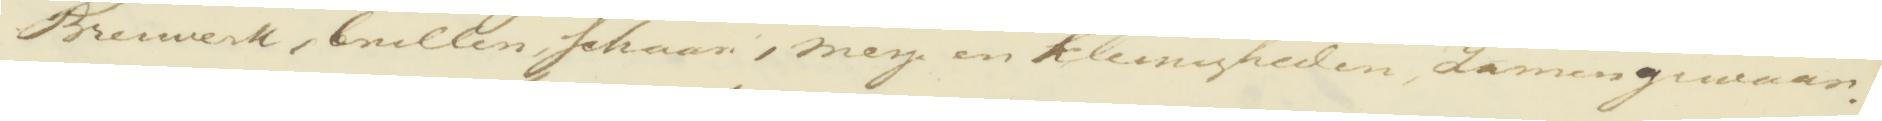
Breswerk, brillen, schaar, mey en kleinigheden, zamen gewaar.
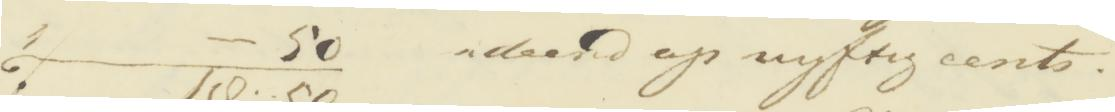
– 50 „deerd op vyftig cents.
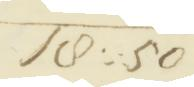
18:50
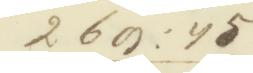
269: 75
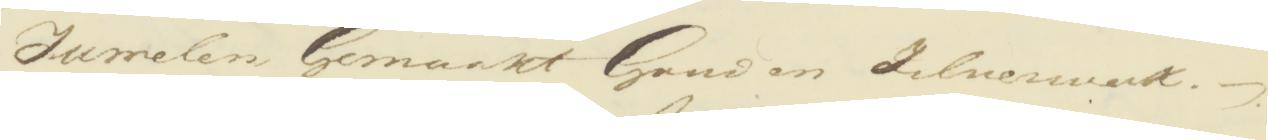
Iuwelen Gemaakt Goud en Zilverwerk. —
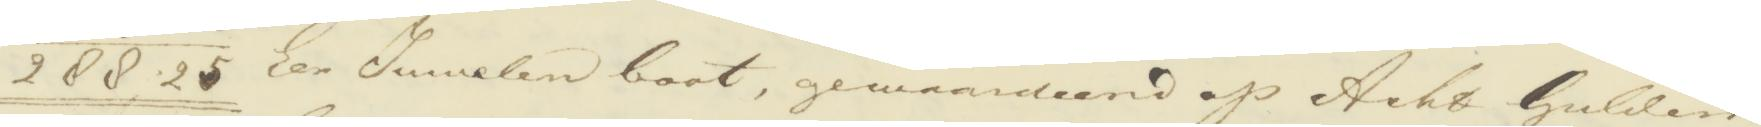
288: 25 Een Iuwelen boot, gewaardeerd op Acht Gulden
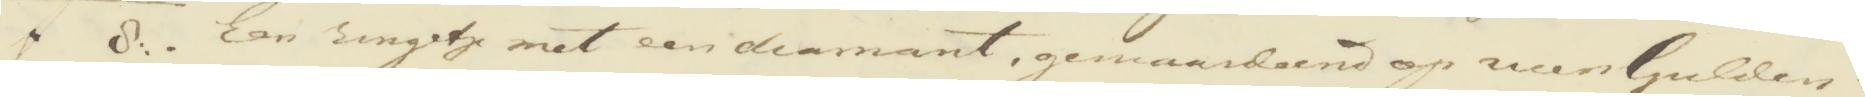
ƒ 8: - Een ringetje met een diamant, gewaardeerd op vier Gulden
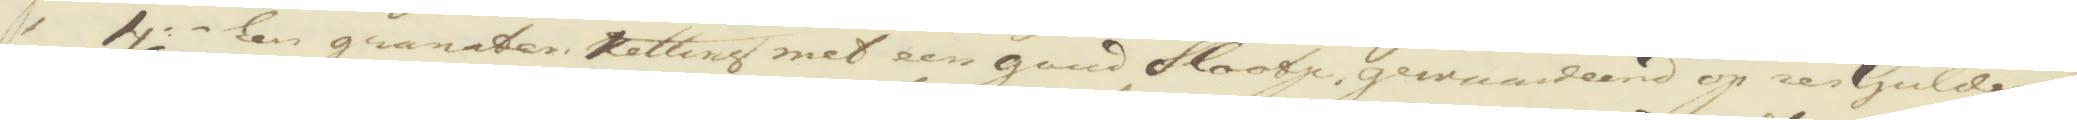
„ 4: – Een granaten ketting met een goud slootje, gewaardeerd op zes Gulden,
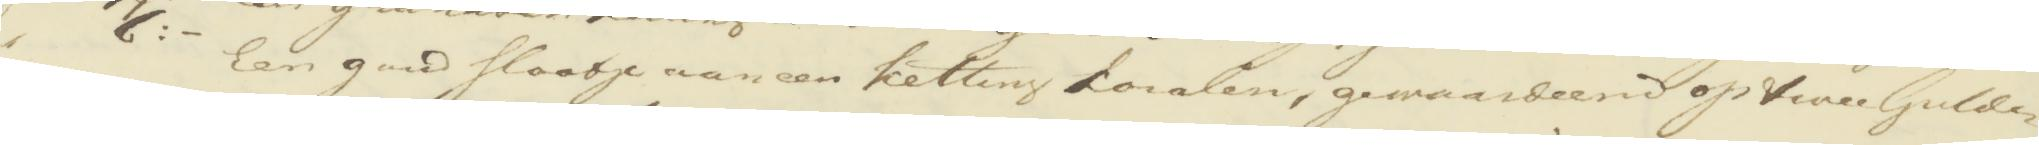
„ 6: – Een goud slootje aan een ketting koralen, gewaardeerd op twee Gulden
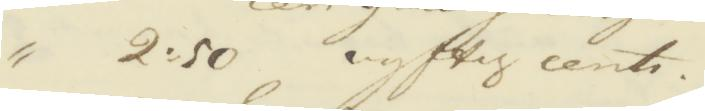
„ 2:50 vyftig cents.
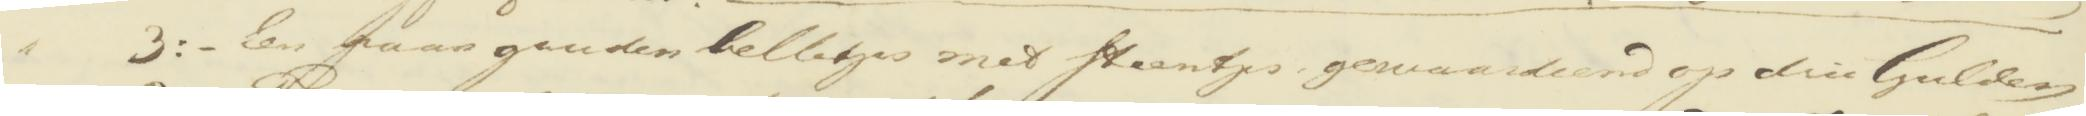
„ 3: - Een paar gouden belletjes met steentjes, gewaardeerd op drie Guldens
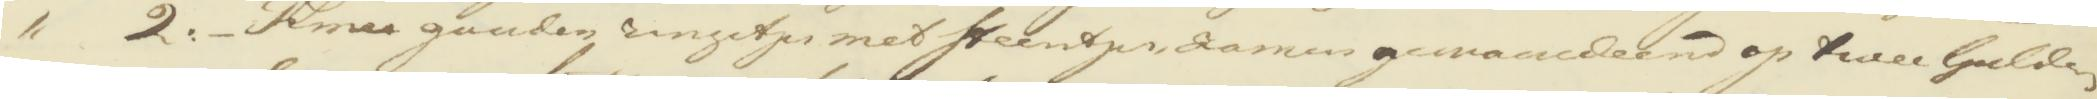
„ 2: – Twee gouden ringetjes met steentjes, zamen gewaardeerd op twee Gulden
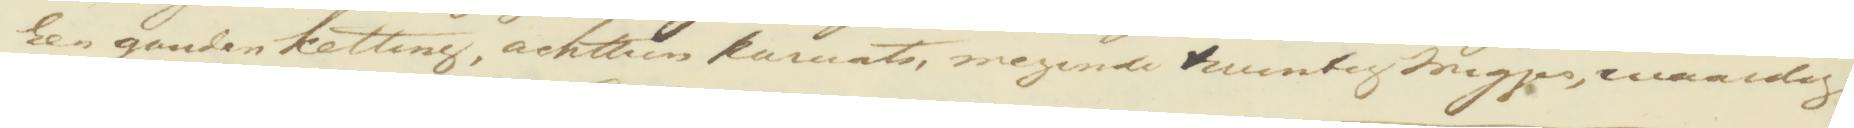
Een gouden ketting, achttien karaats, wegende twintig wigjes, waardig
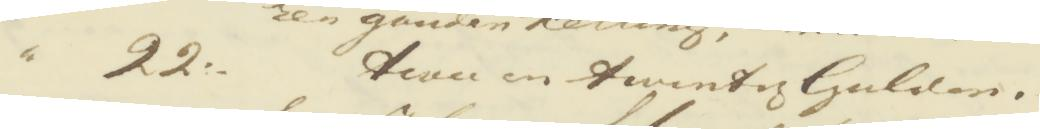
„ 22:- twee en twintig Gulden.
